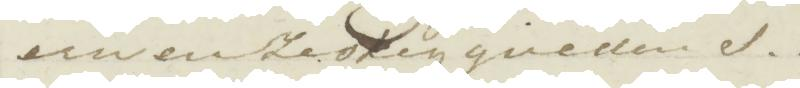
een en zestig guldens. .
